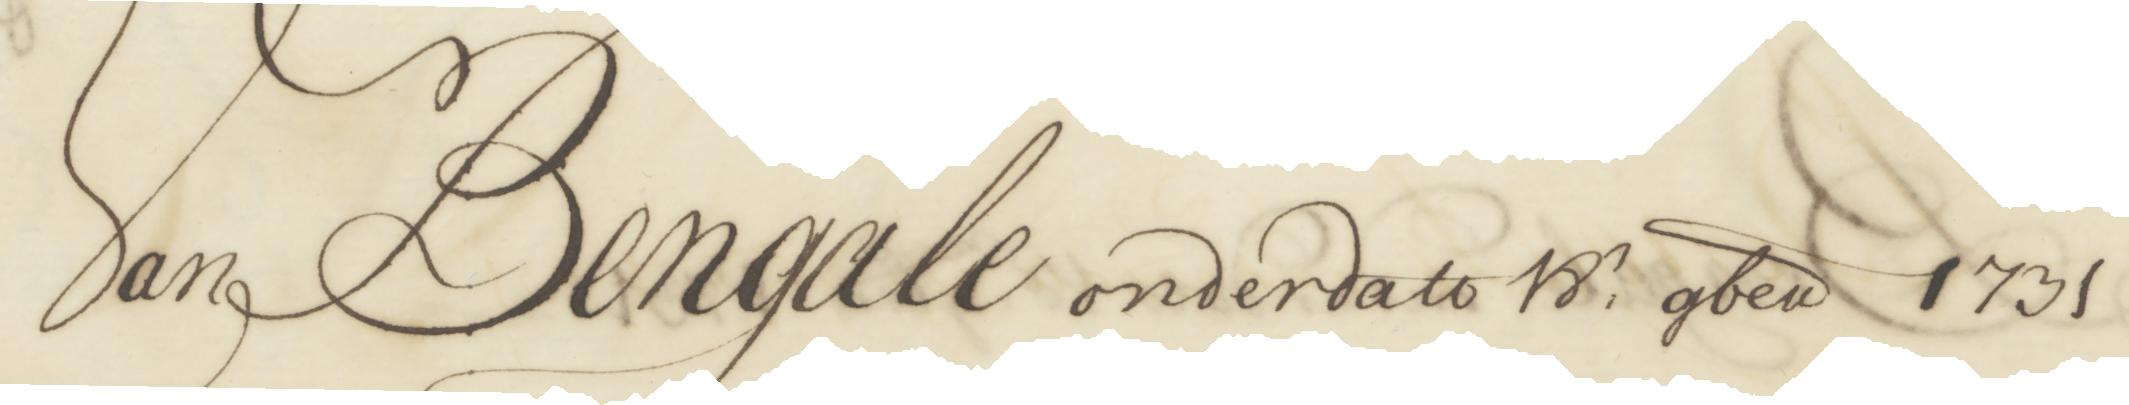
Van Bengale onder dato 18:' 9ber 1731
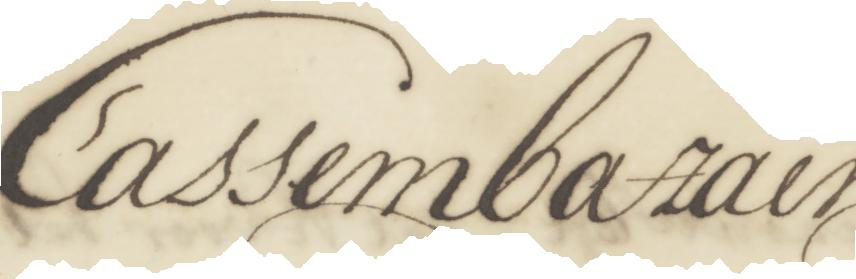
Cassembazaer
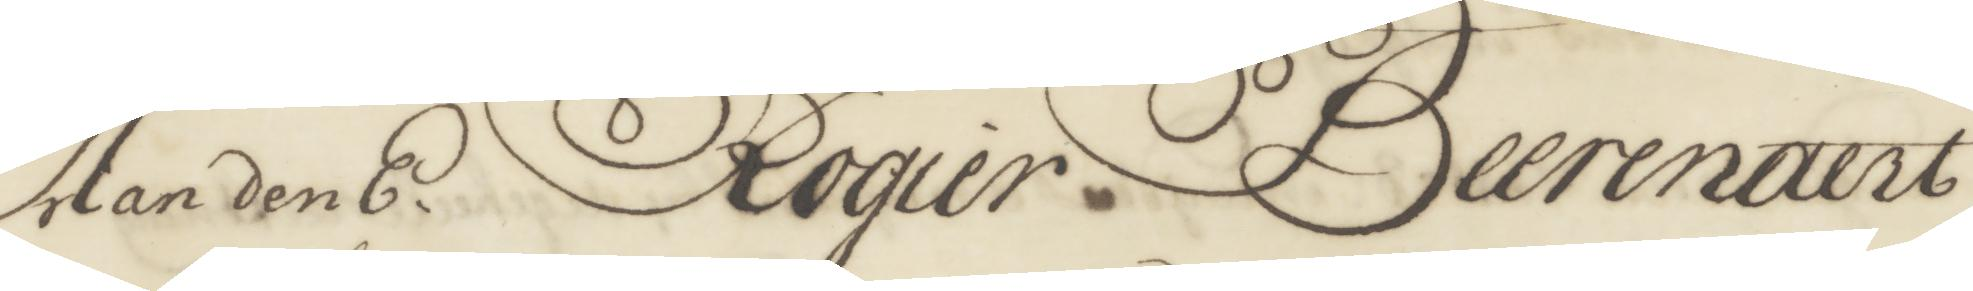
Aan den E: Rogier Beerenaert
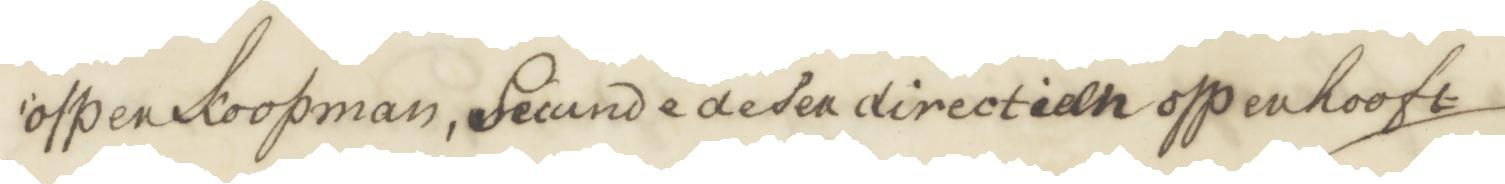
'opperkoopman, secunde deser directieen opperhooft
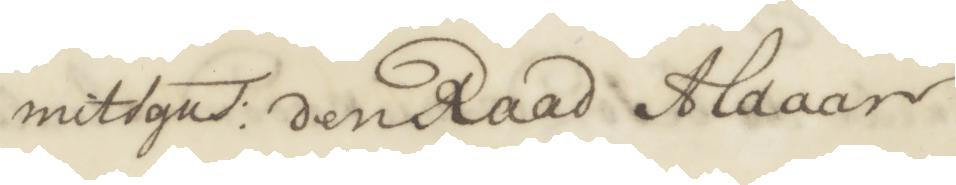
mitsgrs: den Raad Aldaar
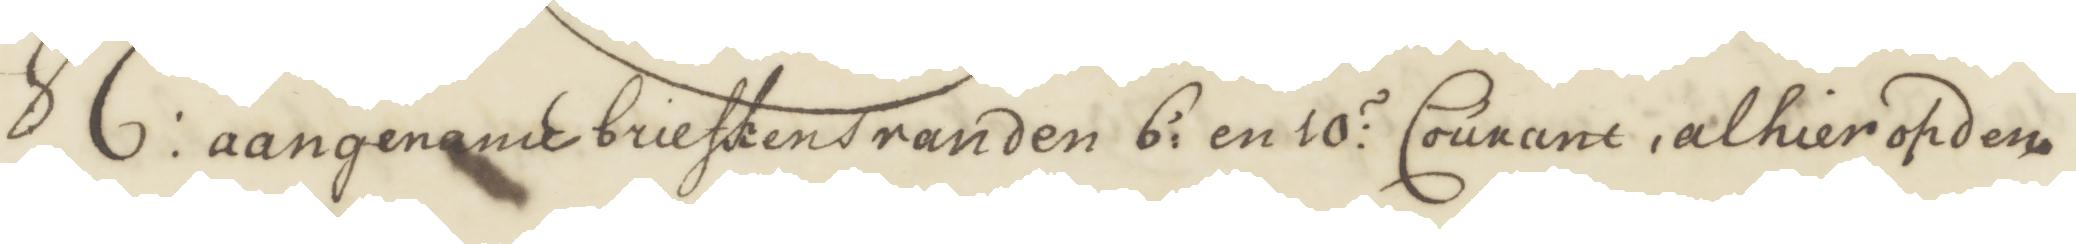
VE: aangename briefkens van den 6:' en 10:' Courant, alhier op den
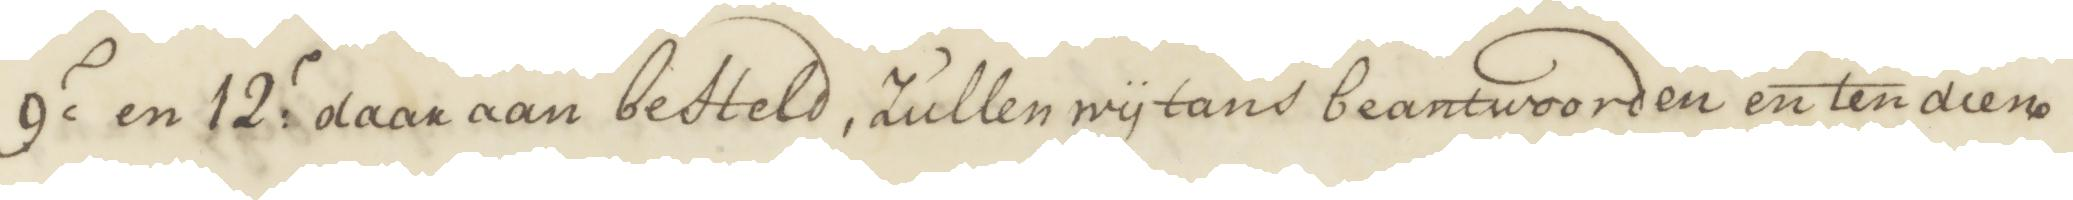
9:' en 12:' daar aan besteld, zullen wij tans beantwoorden en ten dien
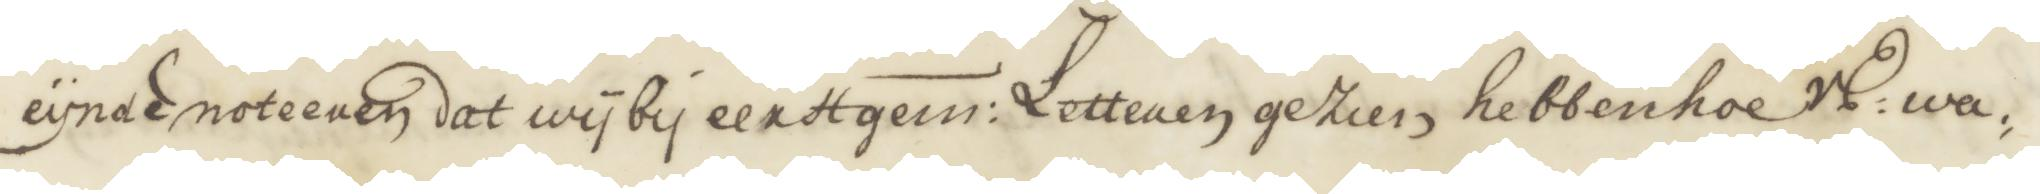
eijnde noteeren dat wij bij eerst gem: Letteren gezien hebben hoe VE: wa„
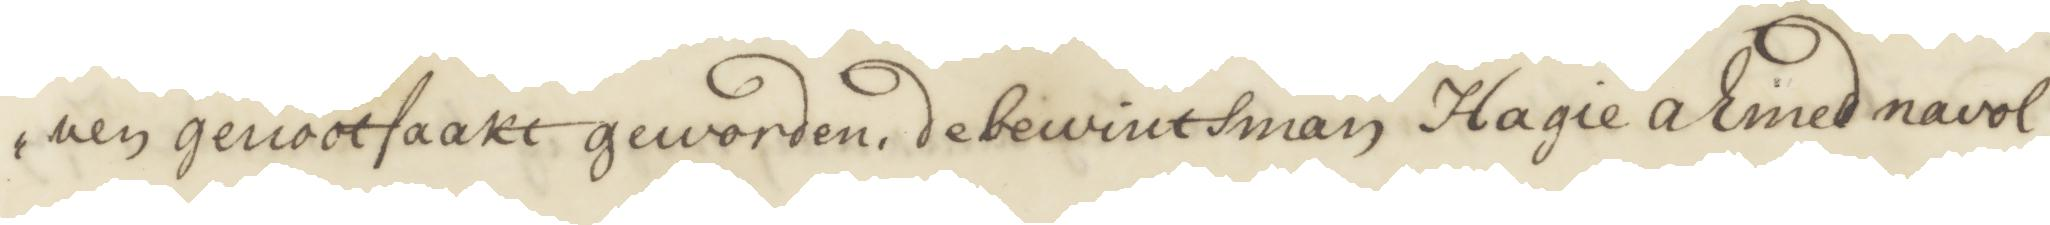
„ren genootsaakt geworden, de bewintsman Hagie a hined navol
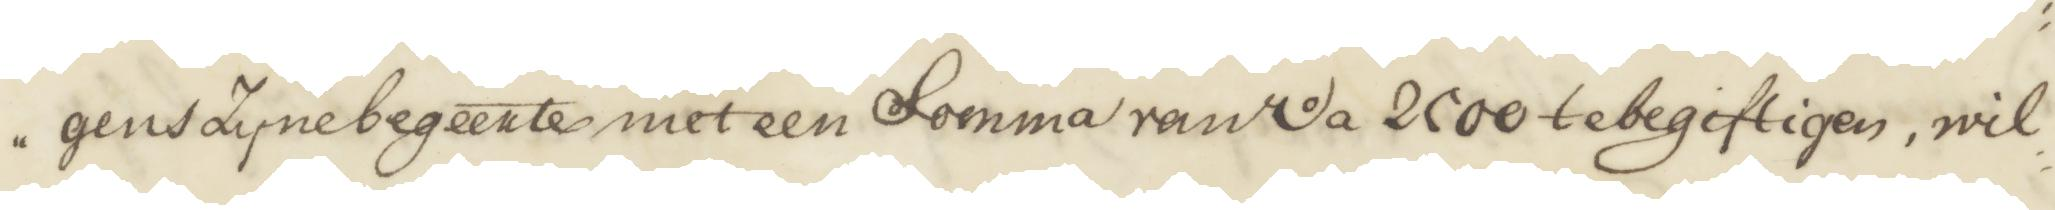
„gens zyne begeerte met een somma van r o/a 2500 te begiftigen, wil
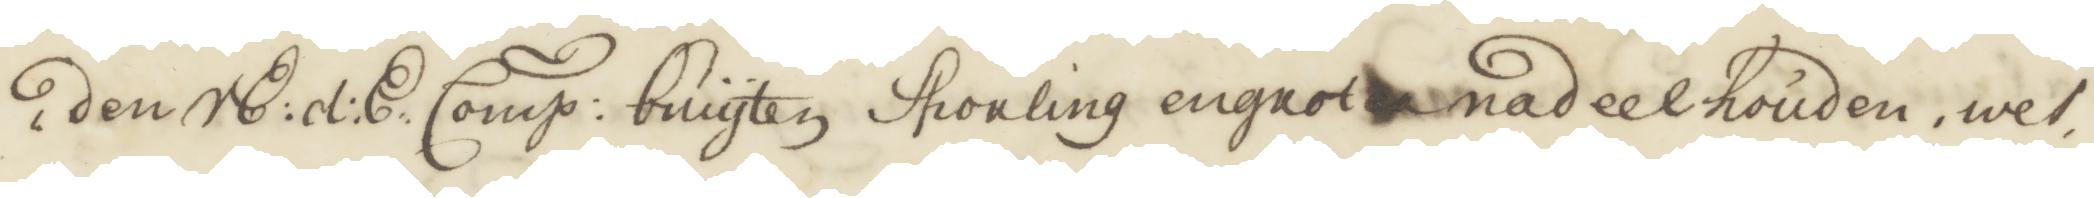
den vE:d:E: Comp: buijten sporling engrot nadeel houden, wes„
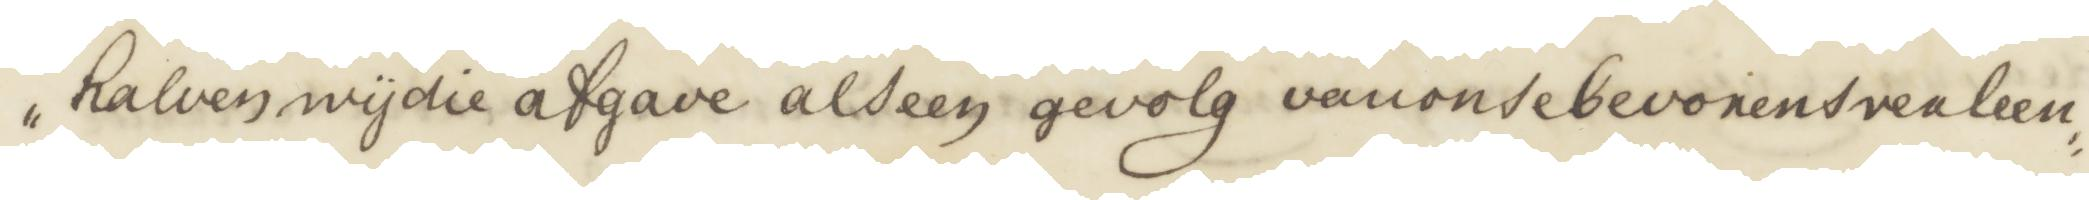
„halven wij die afgave als een gevolg van onse bevorens verleen„
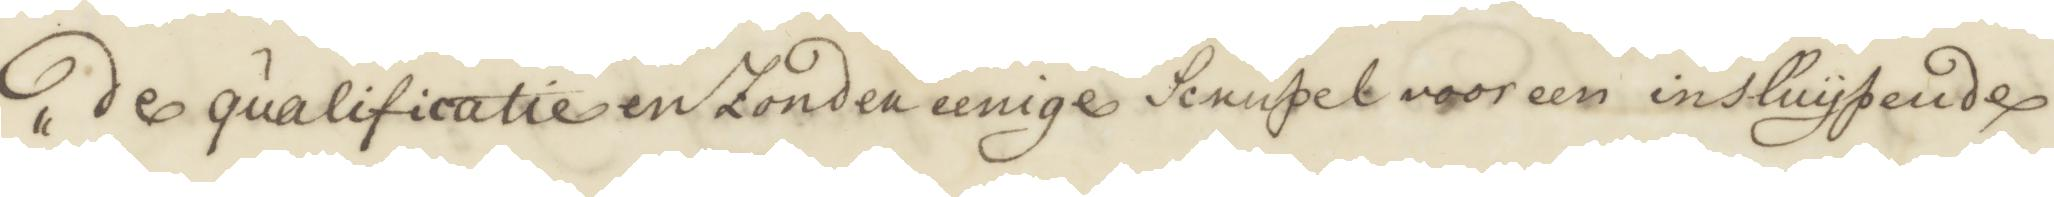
„ de qualificatie en zonder eenige scrupel voor een insluijpende
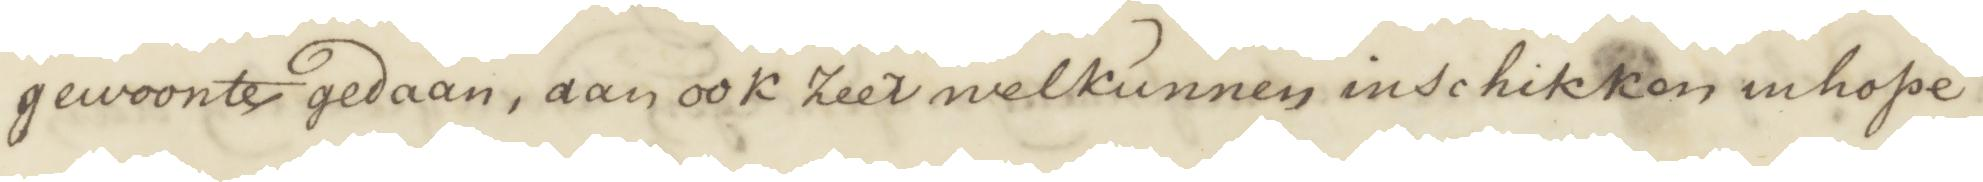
gewoonte gedaan, dan ook zeer welkunnen inschikken in hope
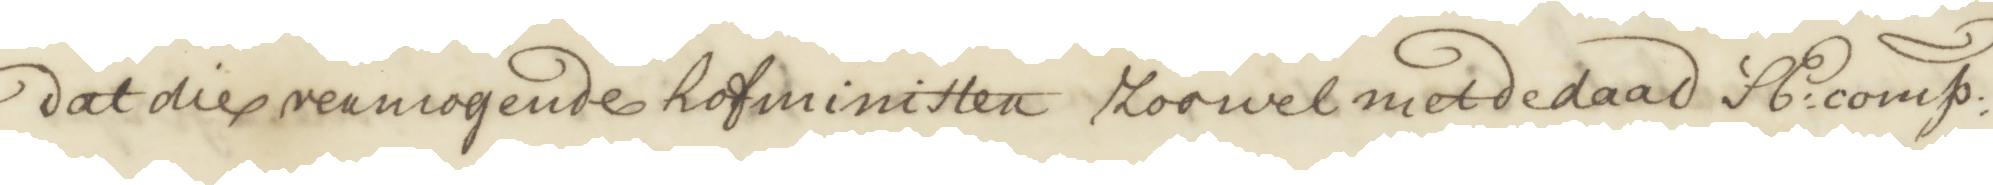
dat die vermogende hofminister zoowel met de daad 'sE:comp
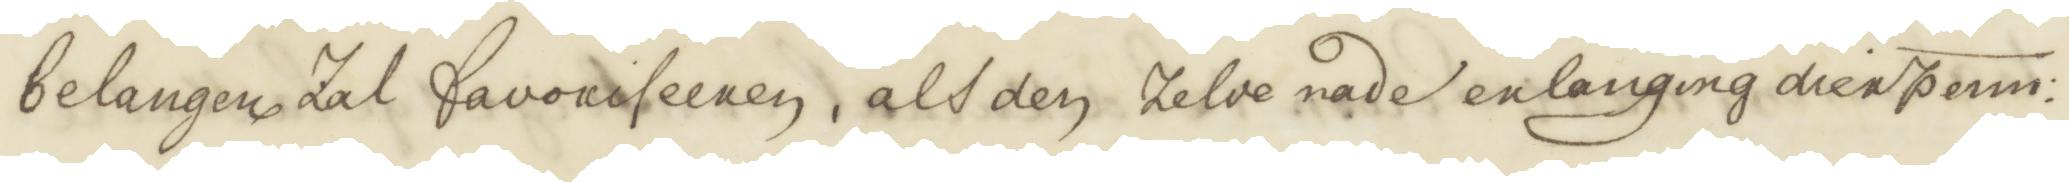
belangen zal favoriseeren, als den zelve na de erlanging dier penn:
